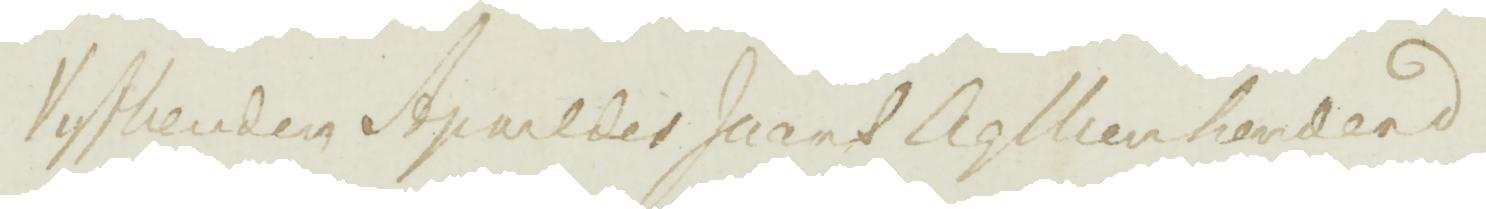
Vyftienden April des Jaars Agttien honderd
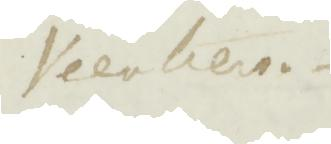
Veertien.
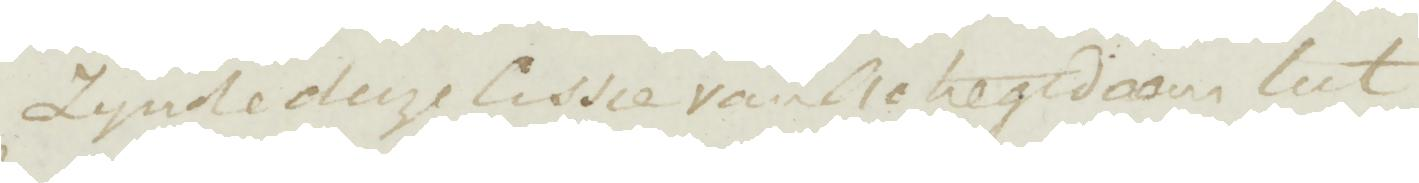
Zynde deeze Cessie van Actie gedaan Uit
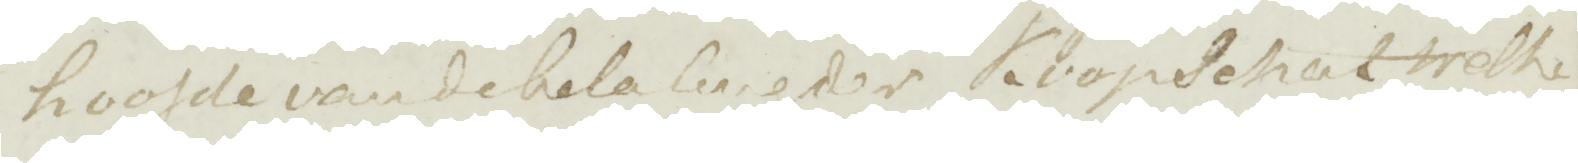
hoofde van de betaling der koopschat, welke
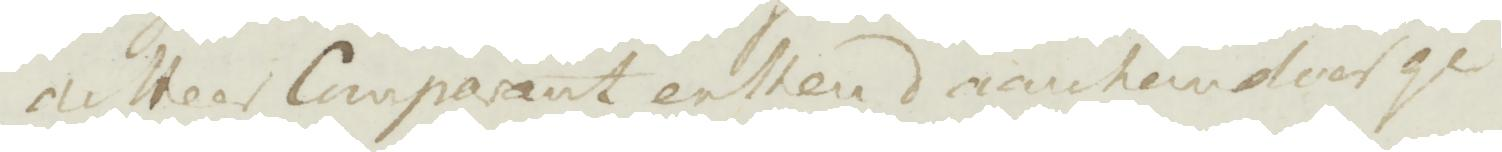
de Heer Comparant erkend aan hem door ge
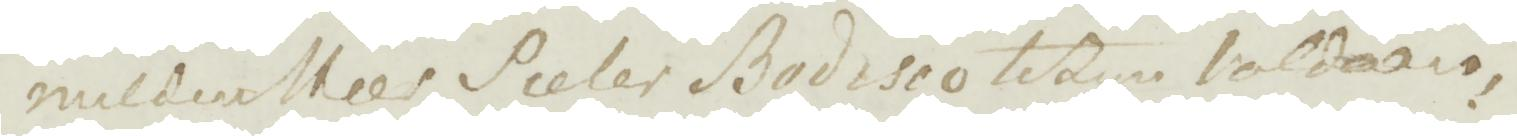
melden Heer Pieter Bodisco te zijn voldaan,
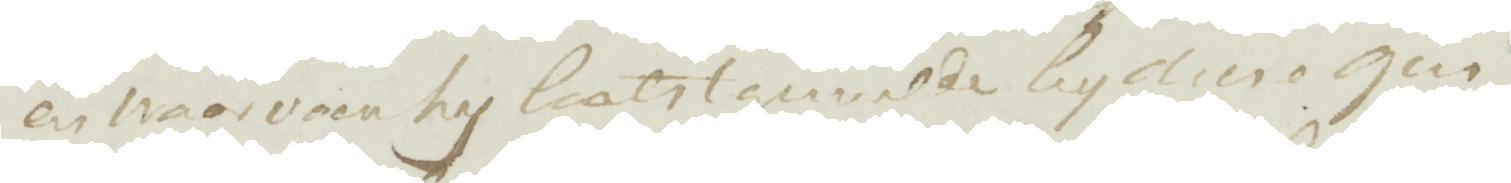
en waar voor hy laatstgemelde by deese qui
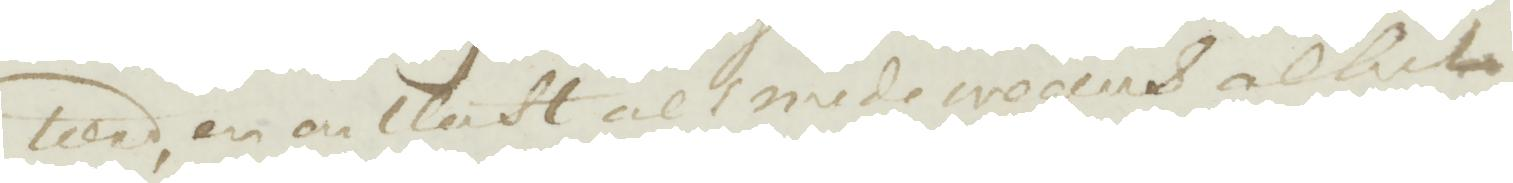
teerd, en ontlast alsmede wegens al het
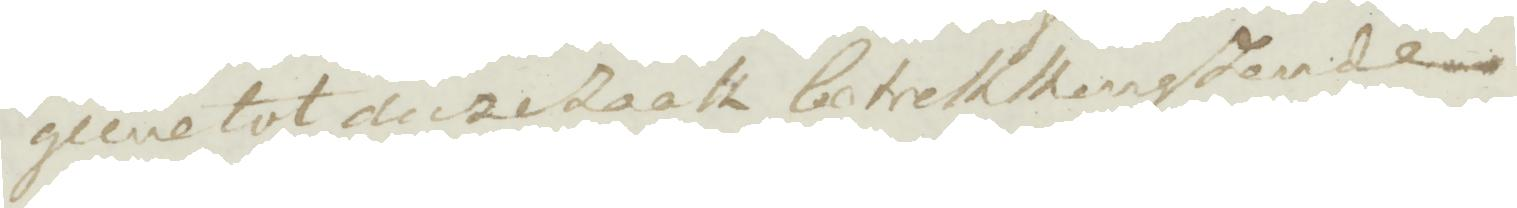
geene tot deze zaak betrekking Zoude
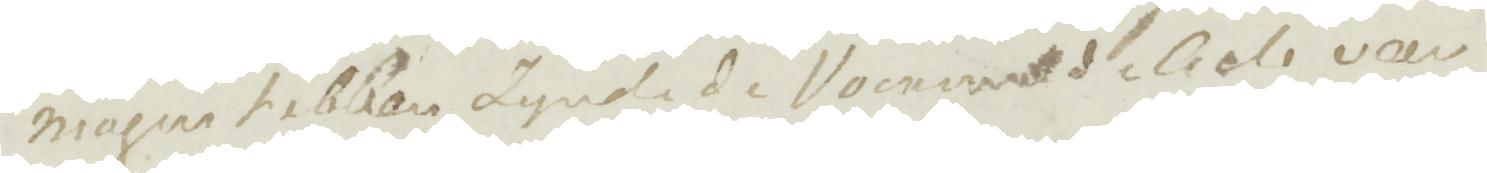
mogen hebben, Zynde de voormelde Acte van
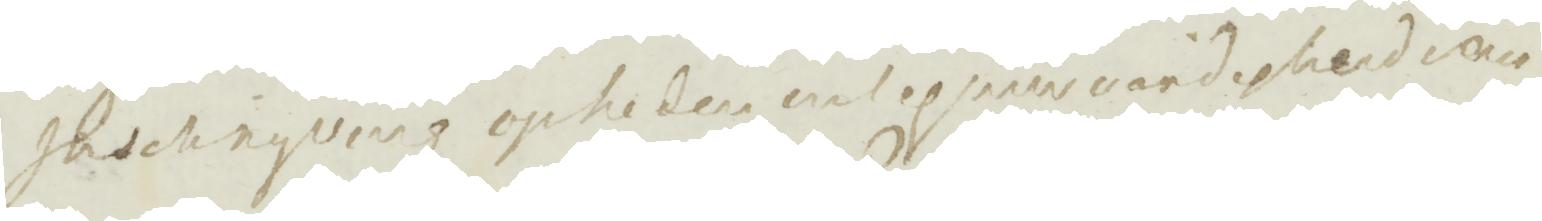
Jnschryving opheden in tegenwoordigheid van
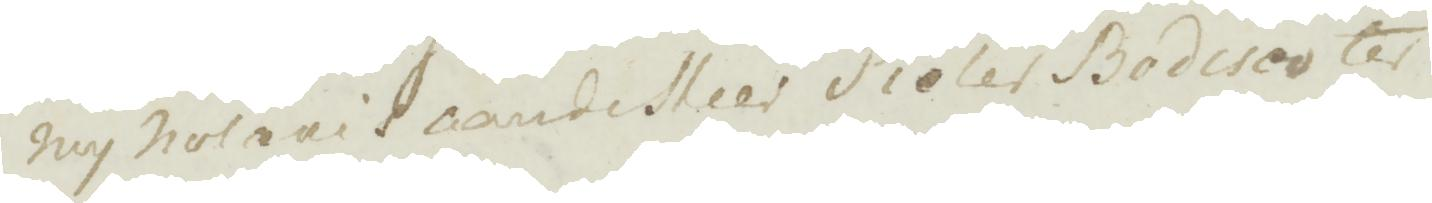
my notaris aan de Heer Pieter Bodisco ter
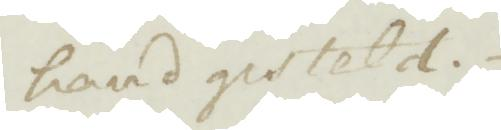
hand gesteld.
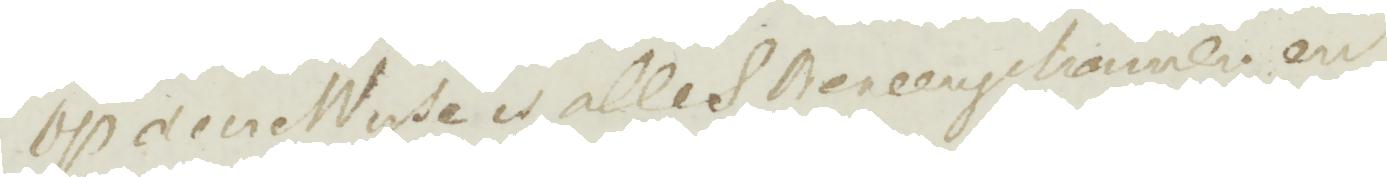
op deeze Wyse is alles overeengekomen en
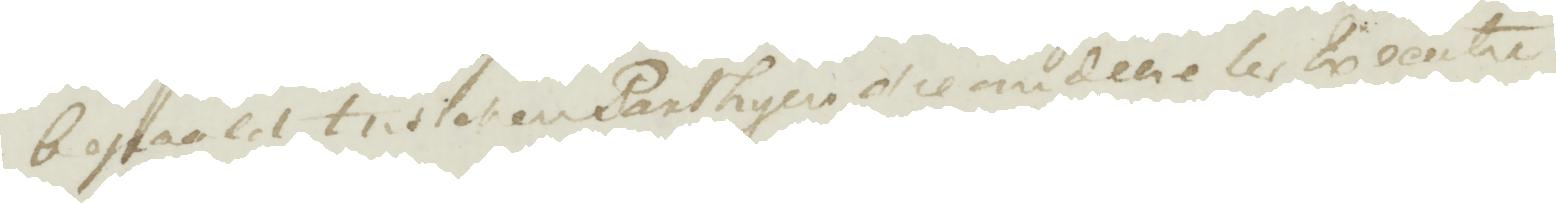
bepaald, tusschen Parthyen, die om deese ter executie
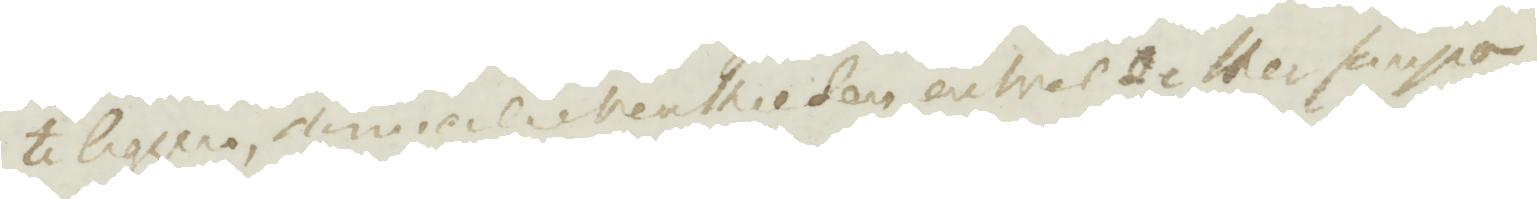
te leggen, domicilie verkiesen en wel de Her Compa
